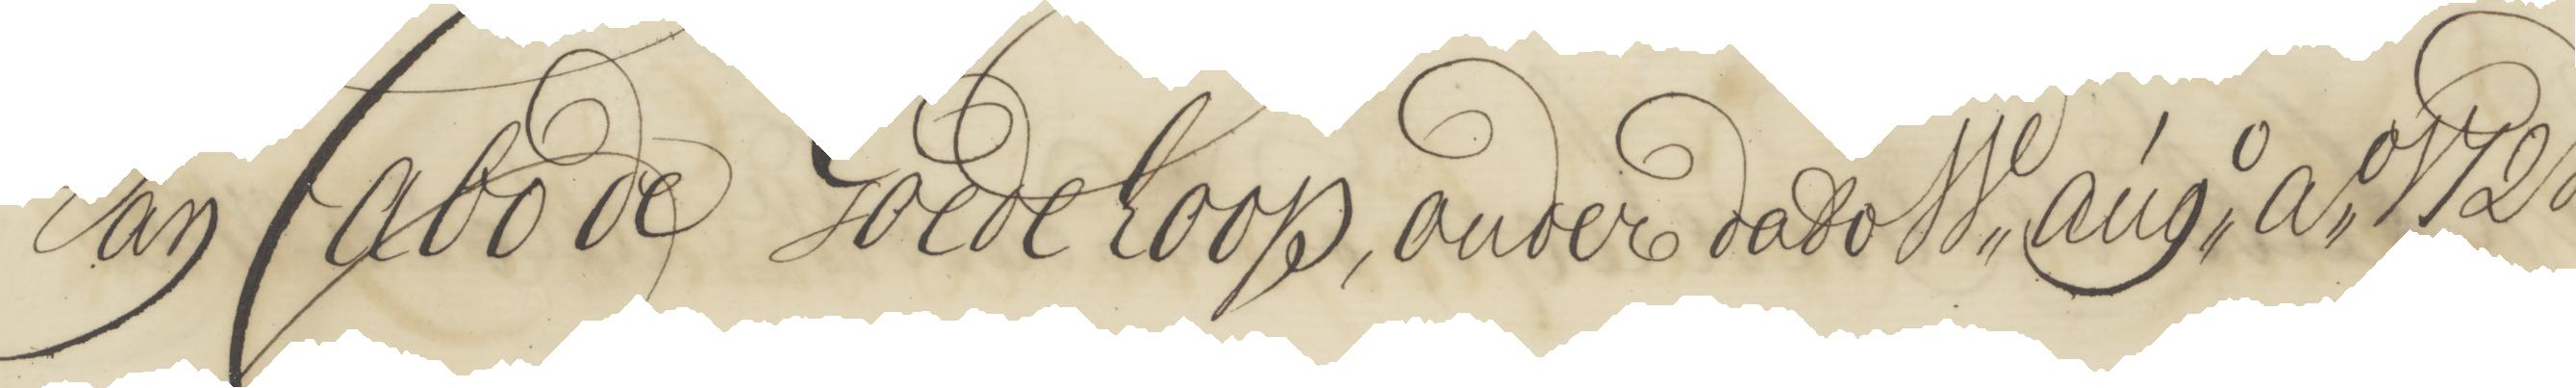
Van Cabo de Goedehoop, onder dato 11„e aug„o a„o 1728:
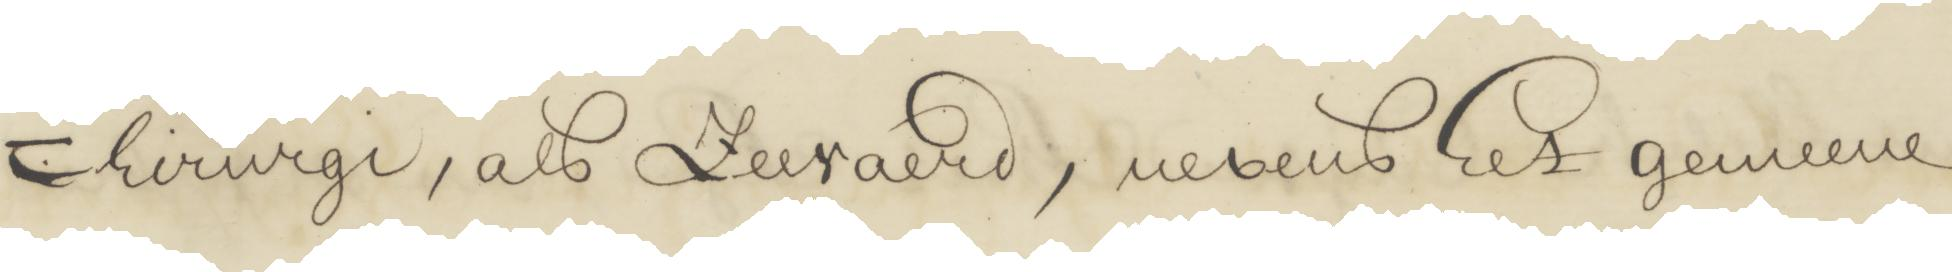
chirurgi, als zeevaerd, nevens het gemeene
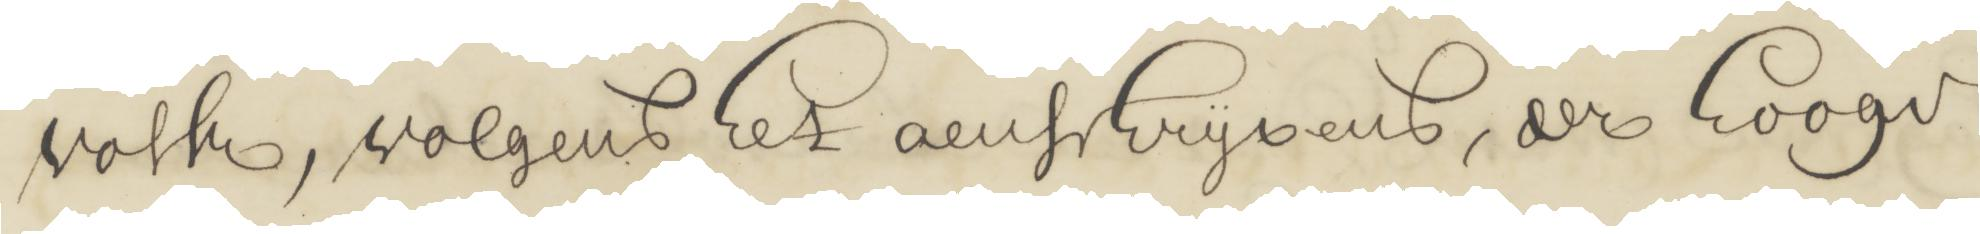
volk, volgens het aenschrijvens, der hooge
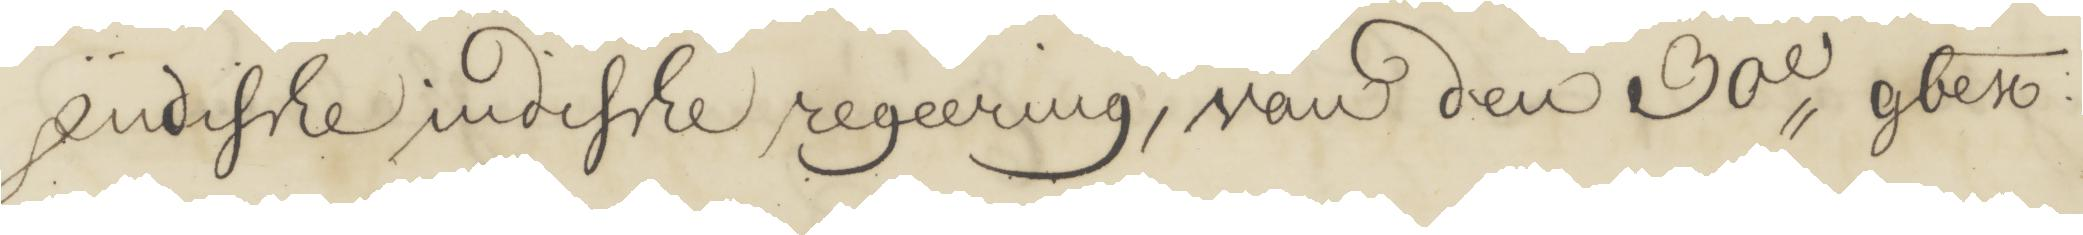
jndische indische regeering, van den 30„e 9ber:
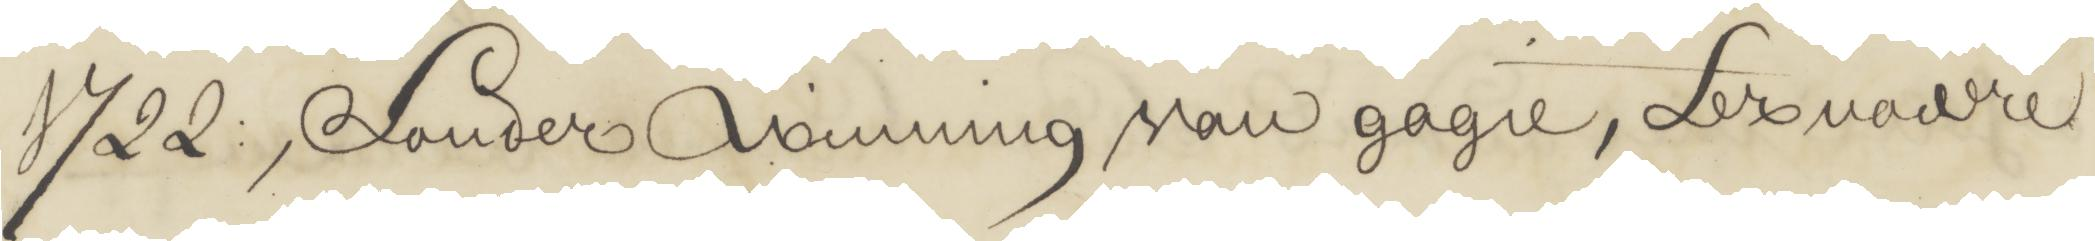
1722:, sonder winning van gagie, ter nadere
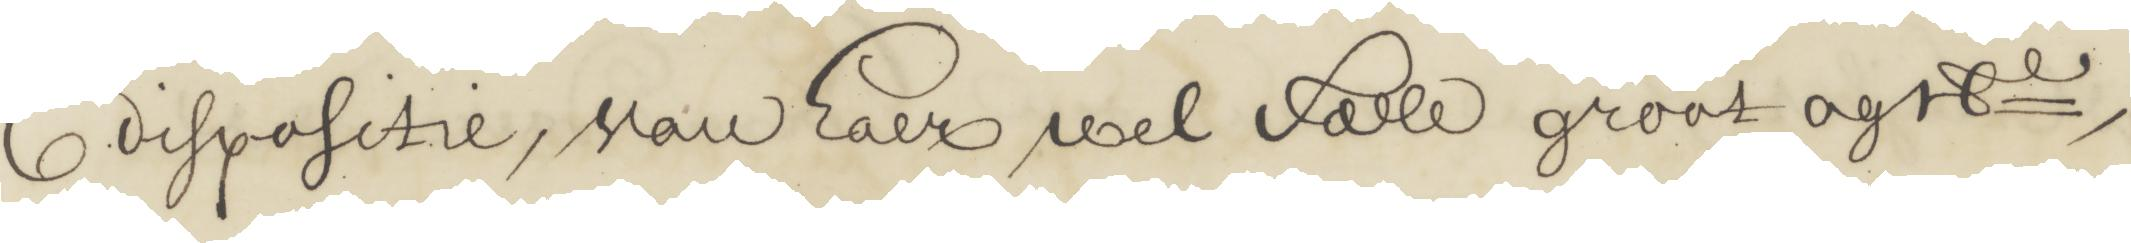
dispositie, van haer wel Edele groot agtb=e,
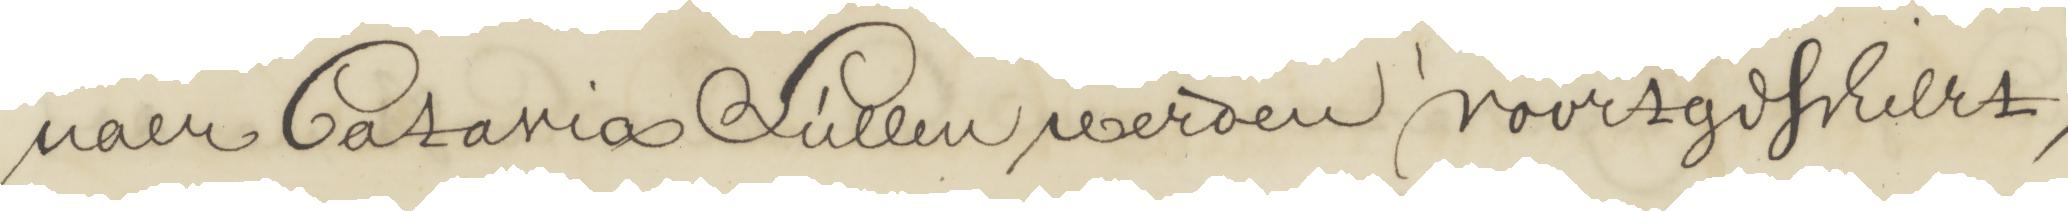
naer batavia sullen werden voortgeschiert,
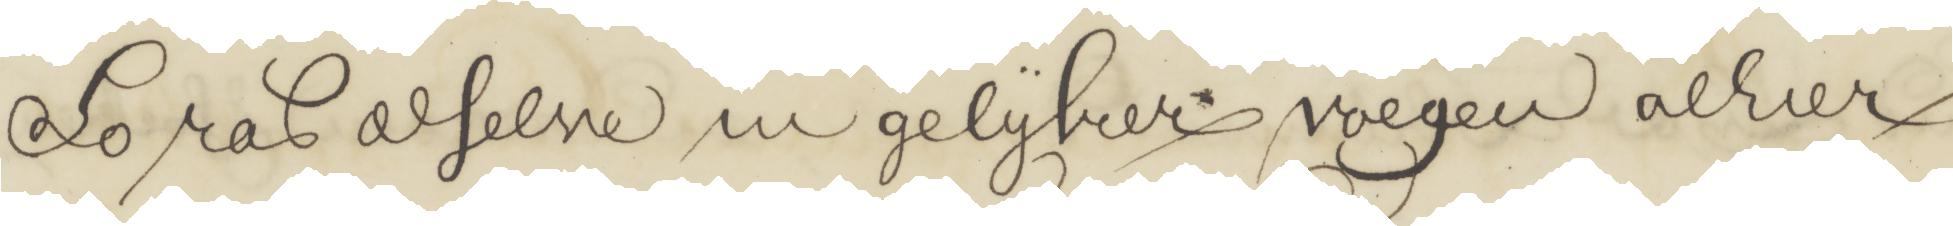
so ras deselve in gelijker wegen alhier
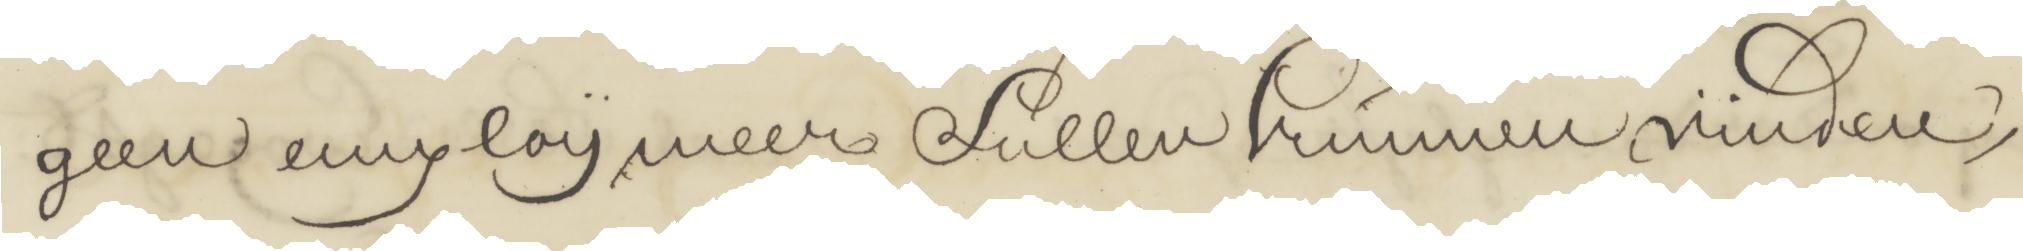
geen emploij meer sullen kunnen vinden,
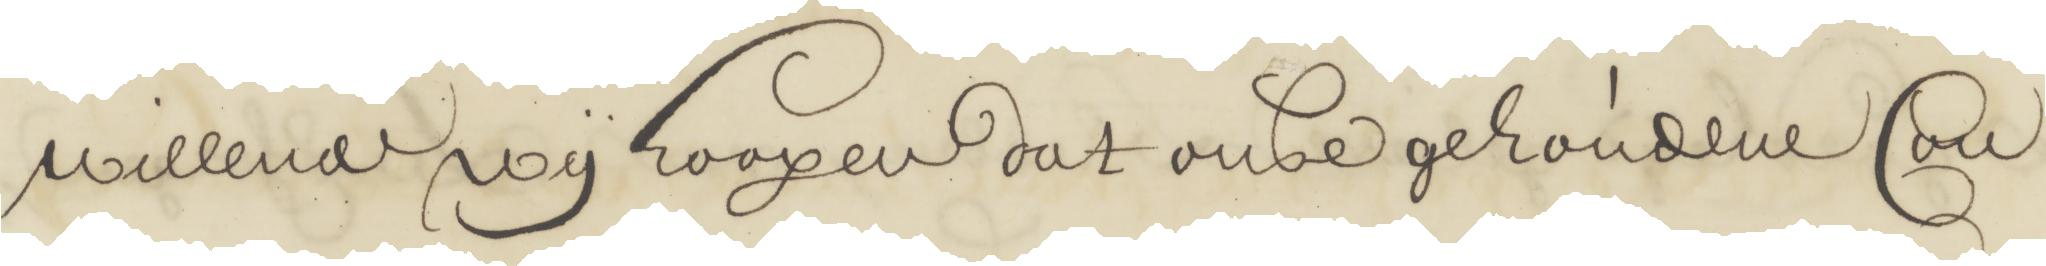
willende wij hoopen dat onse gehoudene Con
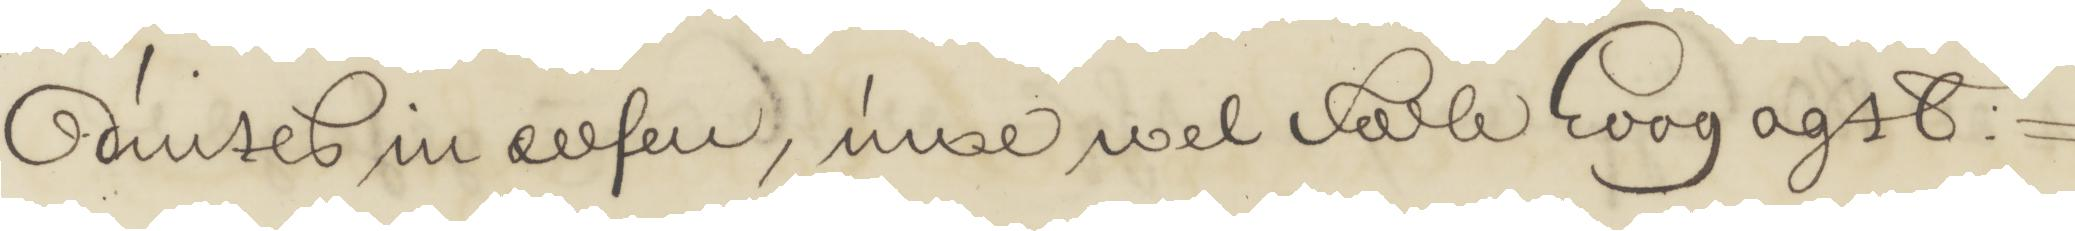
duites in deesen, uwe wel Edele hoog agtb:=
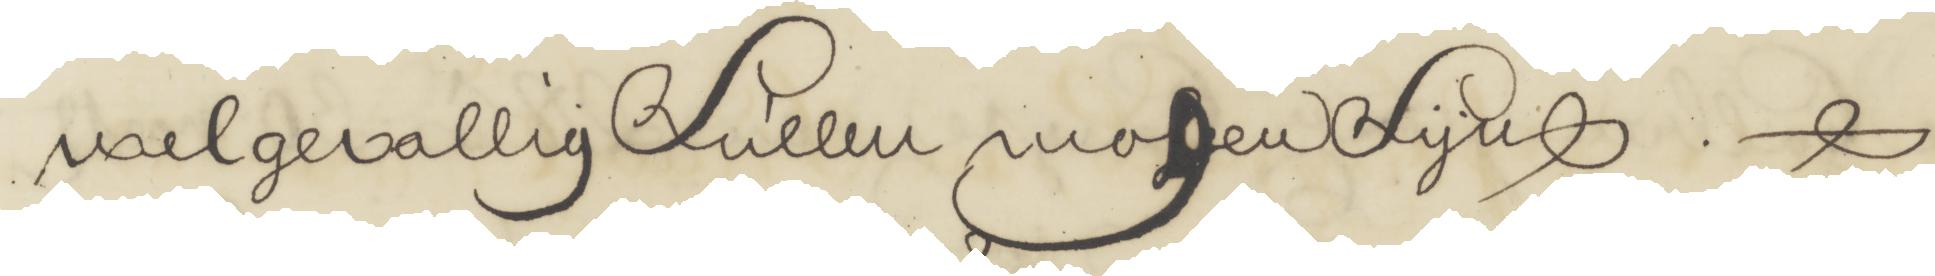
wel gevallig sullen mogen sijne.
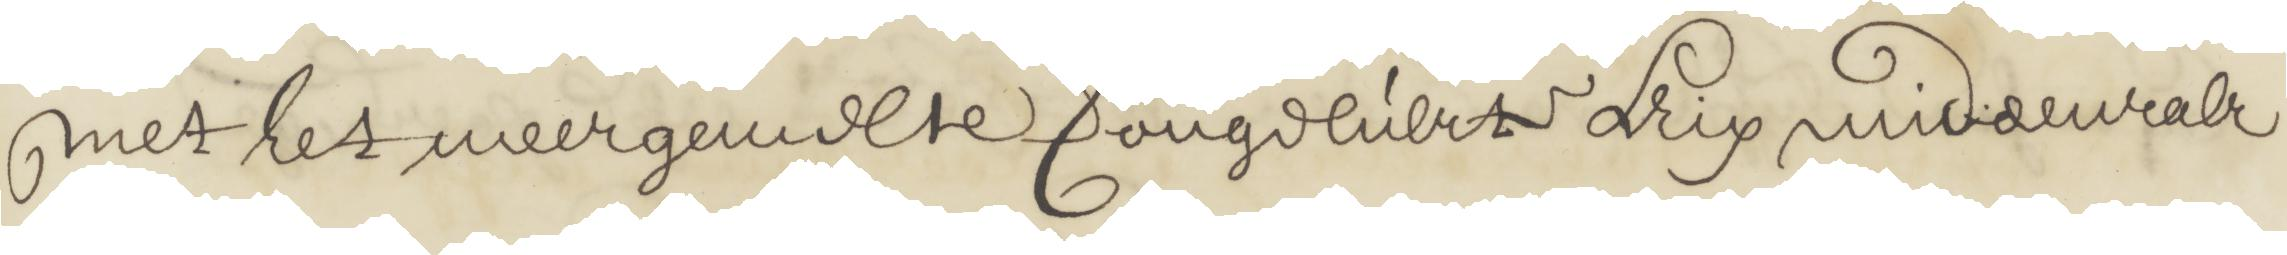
met het meergemelte verongelukte schip middenrak
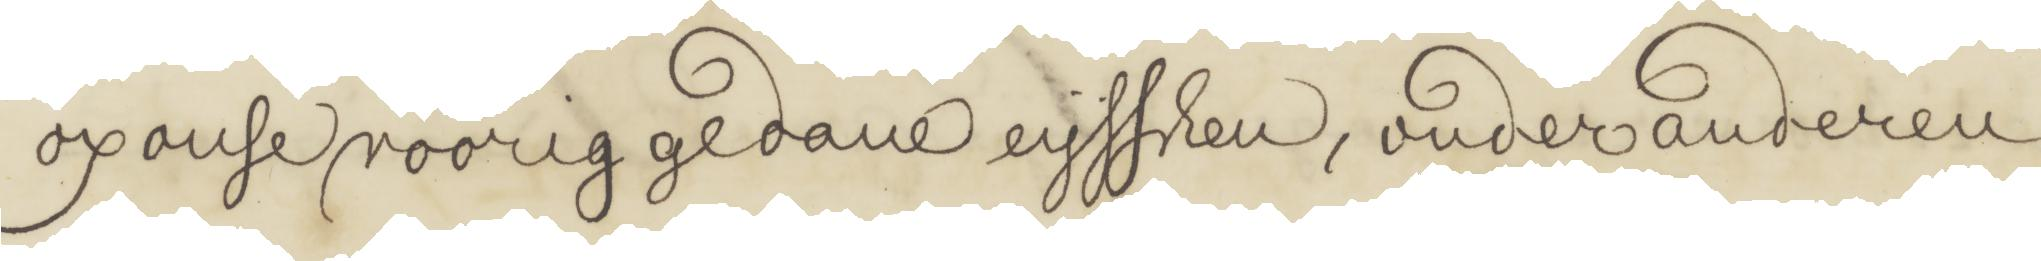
op onse voorig gedane eijsschen, onder anderen
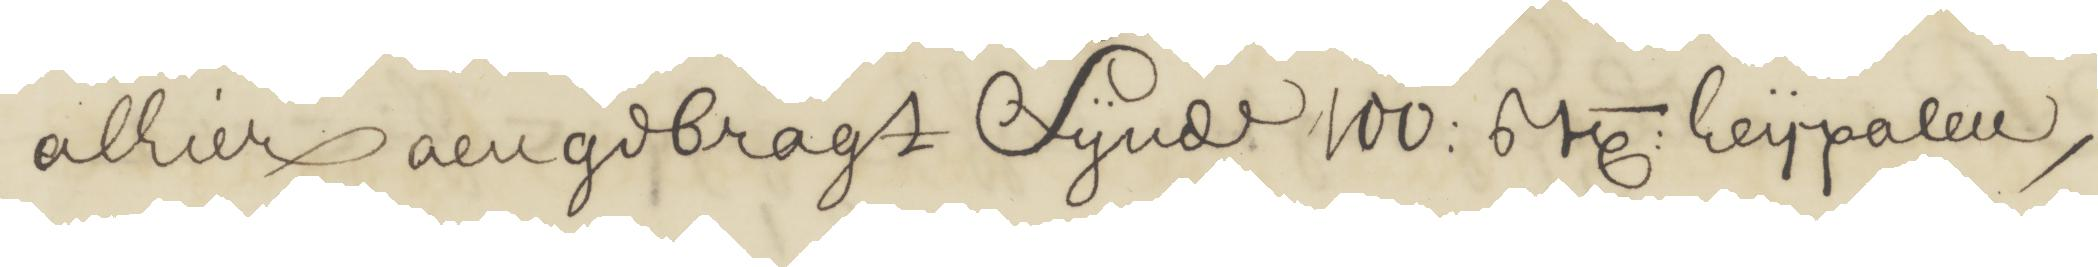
alhier aengebragt sijnde 100: stx: heijpalen,
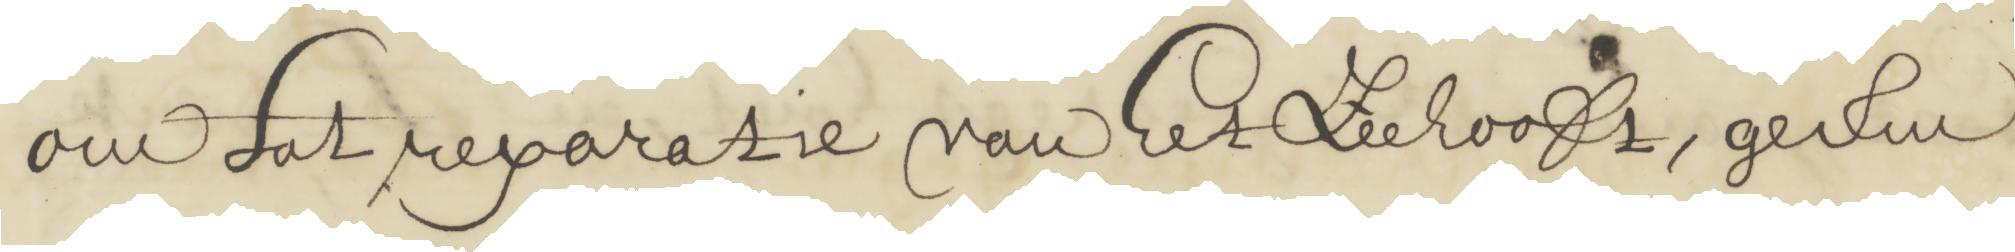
om tot reparatie van het zeehooft, geEm
